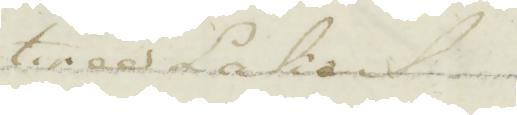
twee Lakens
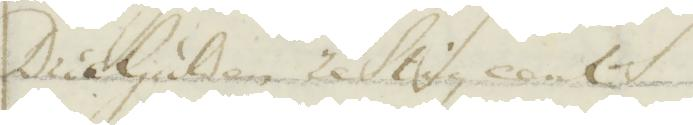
Drie Gulden zestig cents
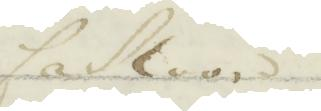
fastoor
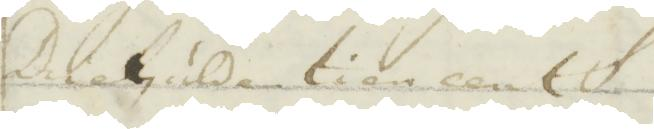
Drie Gulden tien cents
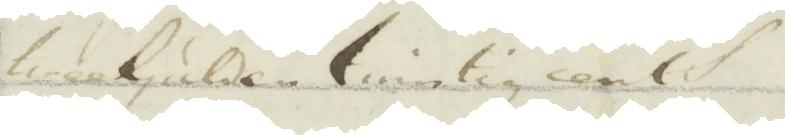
twee Gulden twintig cents
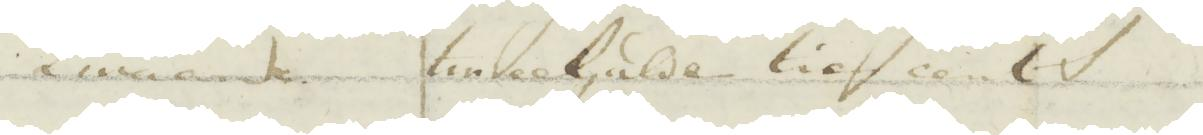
Zwaak twee Gulden tien cents
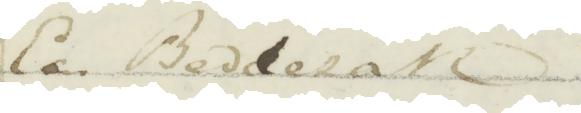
Een Beddezak
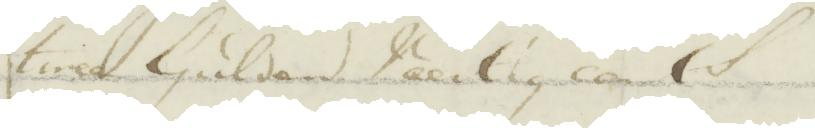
twee Gulden Veertig cents
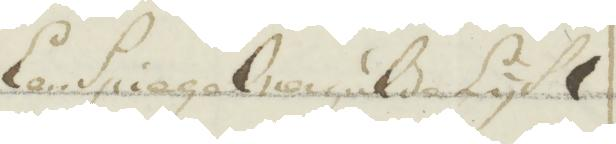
Een Spiegel vergulde Lijst
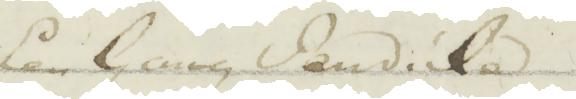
Een Gang Pan dito
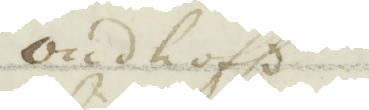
oudhoff
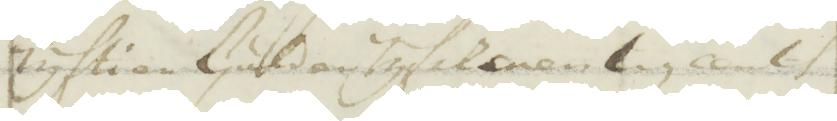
Vijftien Gulden vijfenzeventig cents
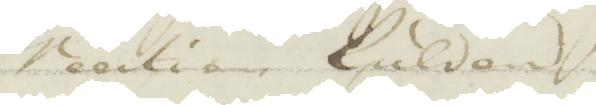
Veertien Gulden
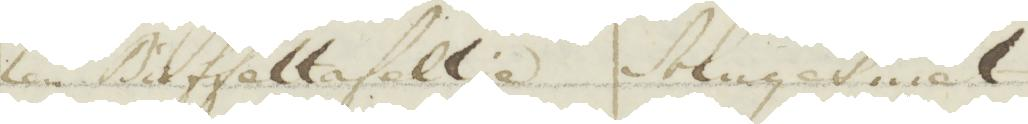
Een Buffettafeltje A Engesmet
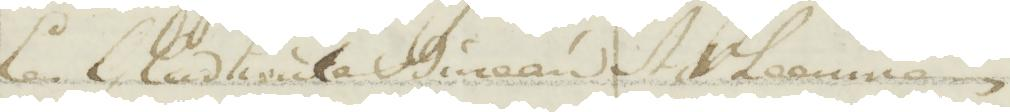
Een Gladhoute Bureau A V Leeuwen
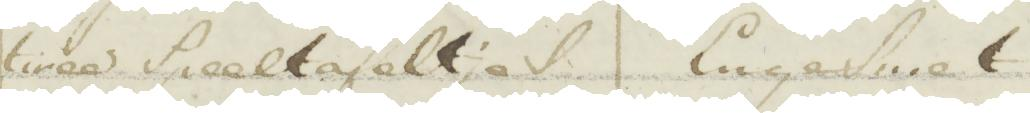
twee Speeltafeltjes Engesmet
